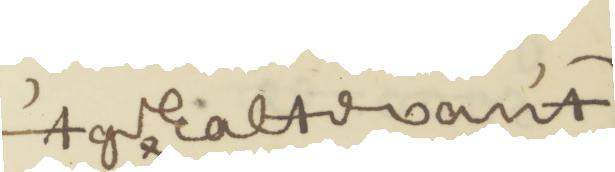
't gehalte van’t
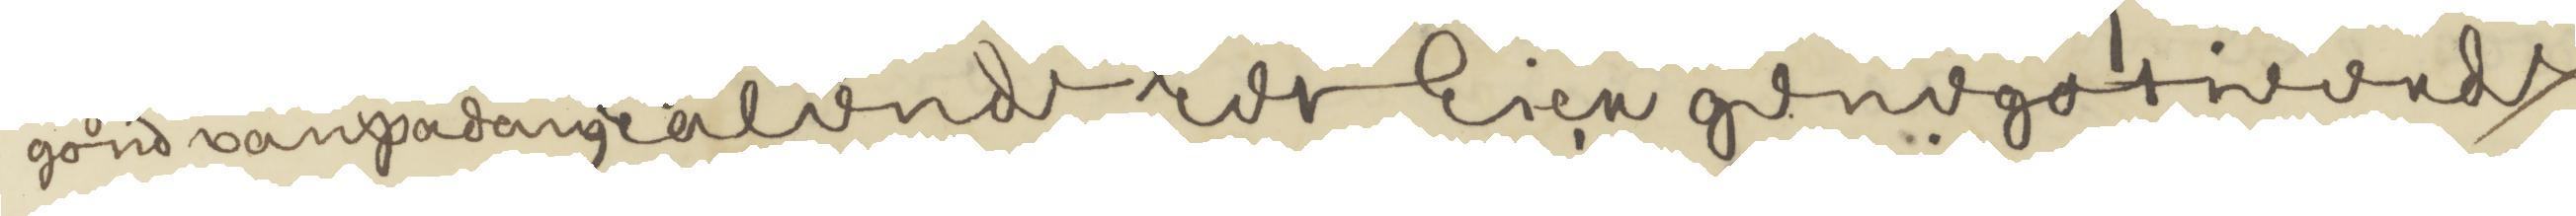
goud van padang halende het hier genegotieerde
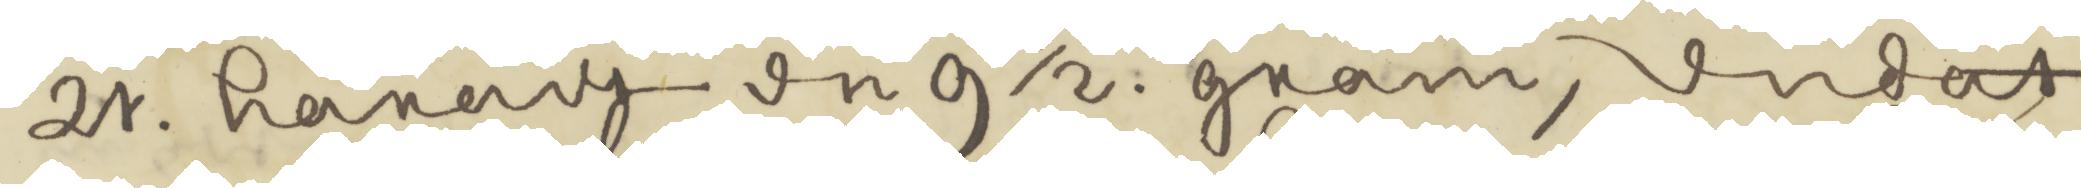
21. karaet en 9½. gram, en dat
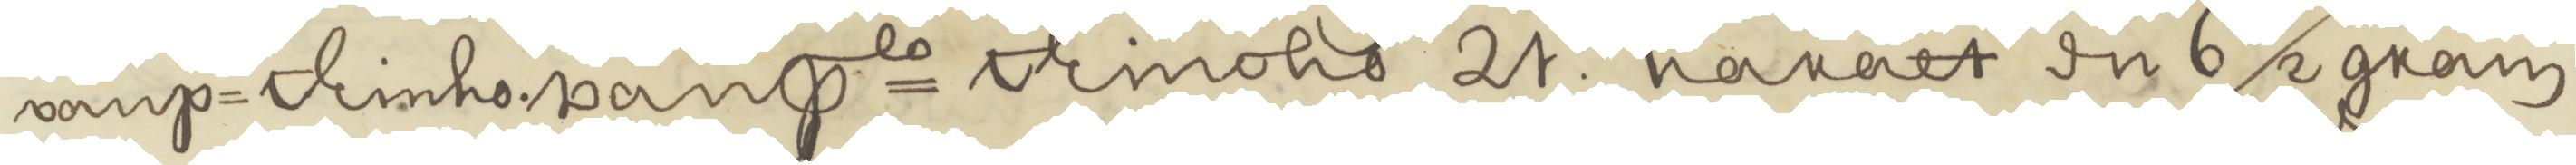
van p=lo Chinko van p=lo Chincko 21. karaet en 6½ gram
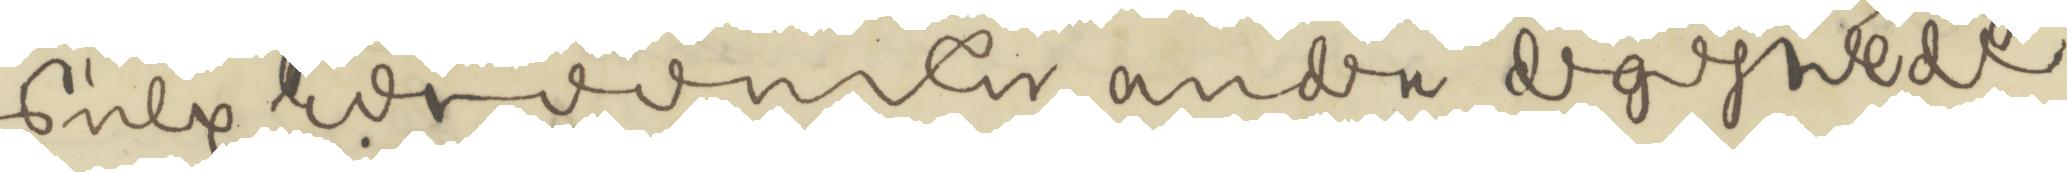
sulx het een en ander de gestelde
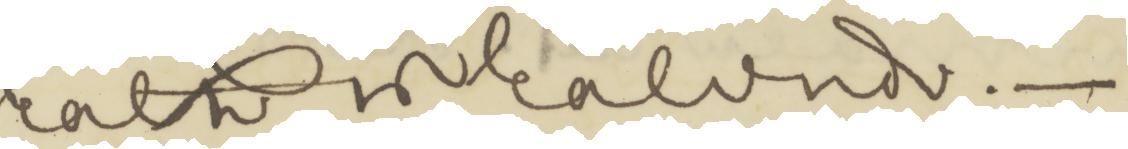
halt is halende.—
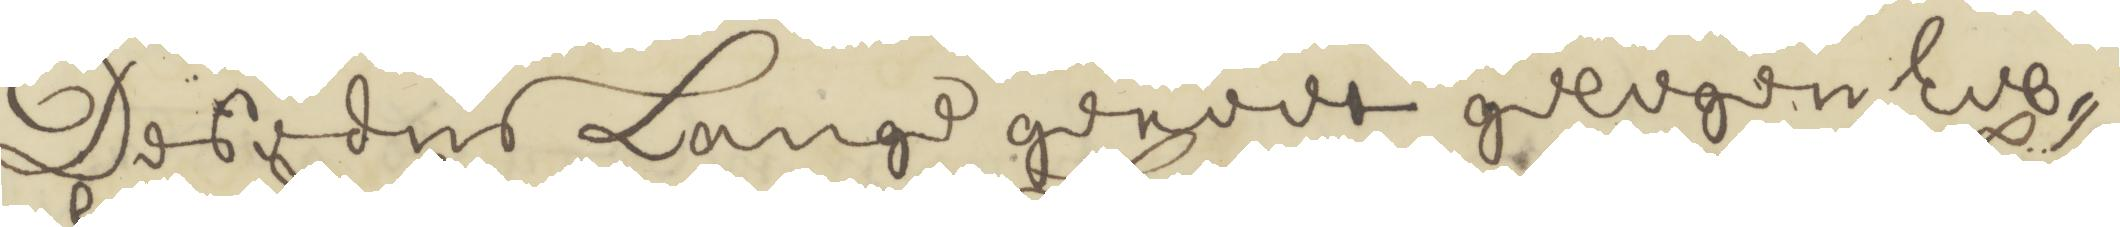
Dese dus Lange gereet gelegen heb„
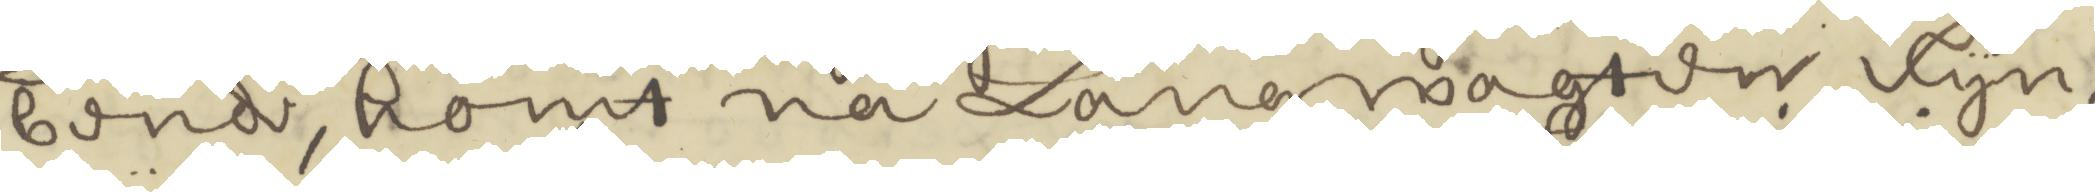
bende, komt na lang wagten eijn„
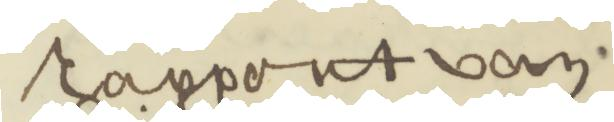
rapport van
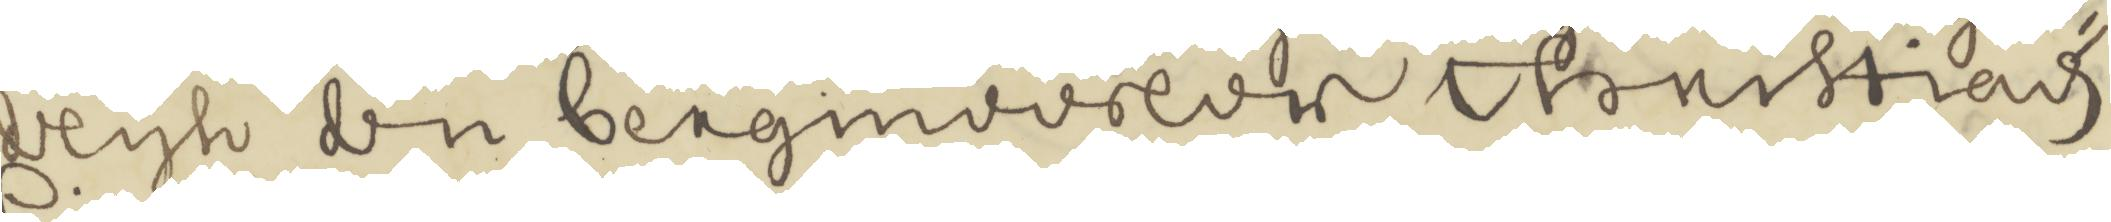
delijk den bergmeester Christiaen
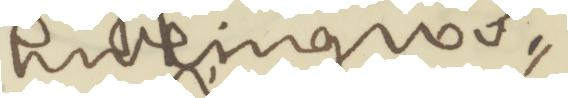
kieling we„
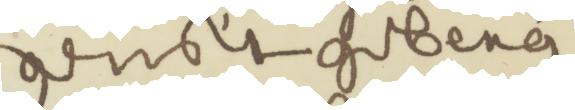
gens 't geberg
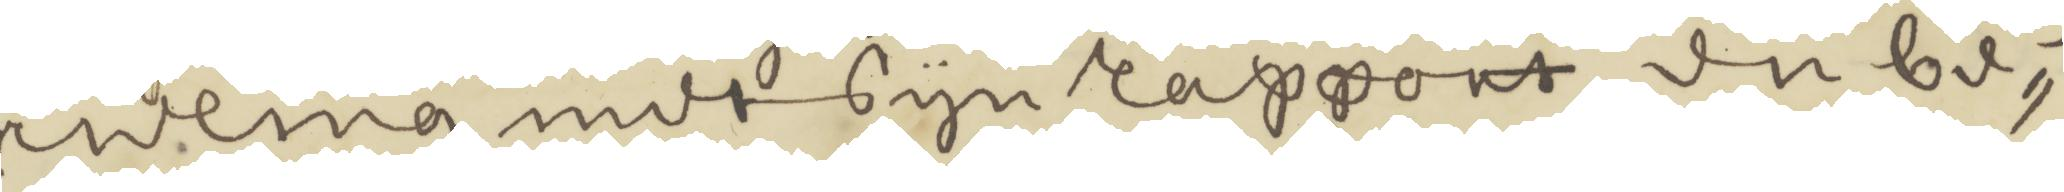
kieling met sijn rapport en be„
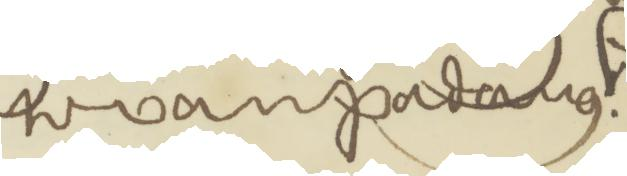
te van padang.
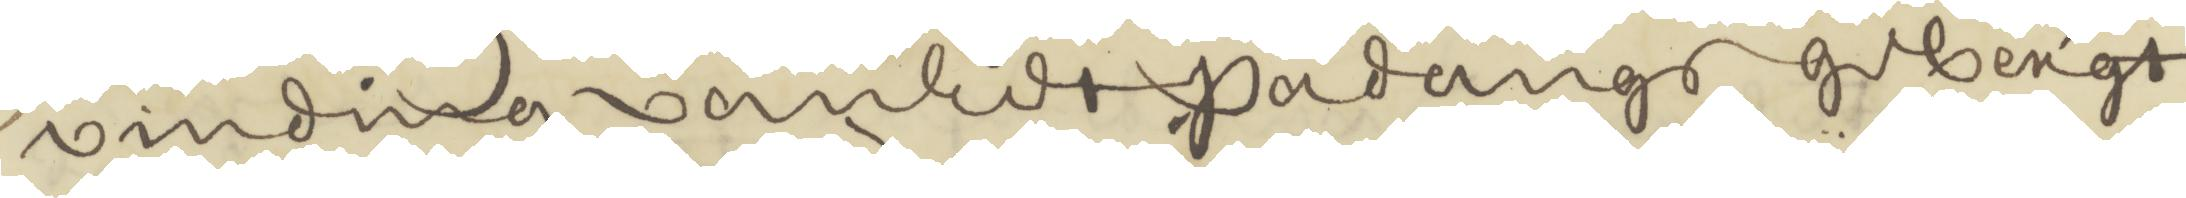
vinding van het padangs gebergt
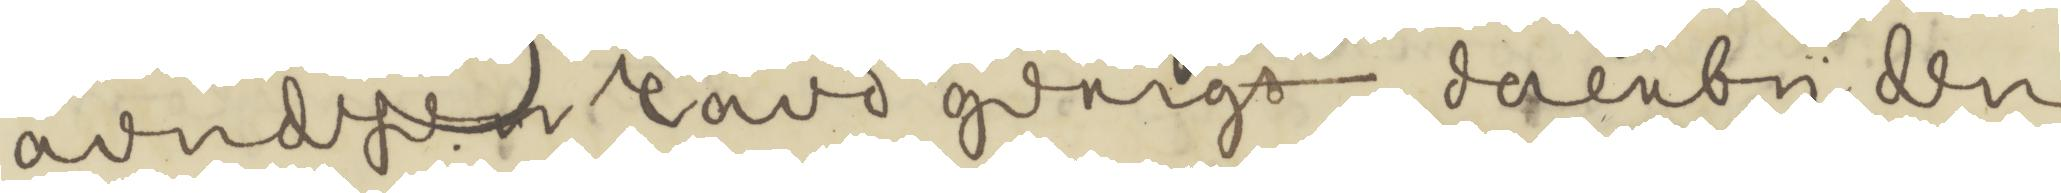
aen desen raed gerigt, daerbij den
